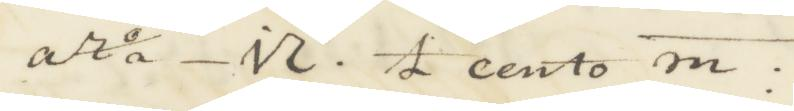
a ro/a — 12 . t cents m
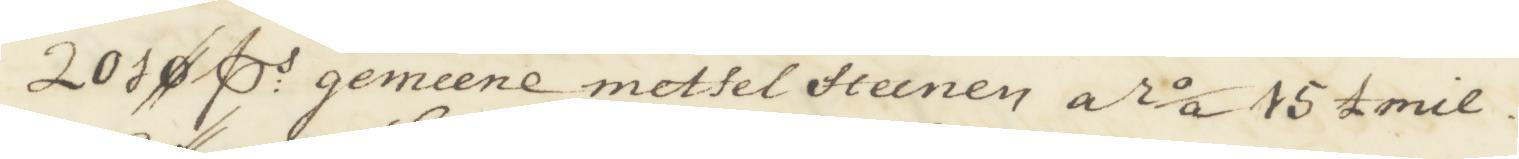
201Ø p:s gemeene metsel steenen a ro/a 15 t mil.
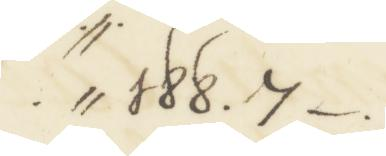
. „ 188. 7 —
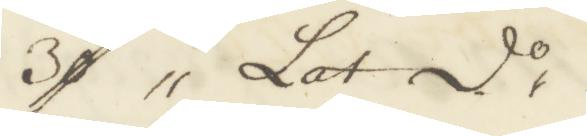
3Ø „ Lat d„o
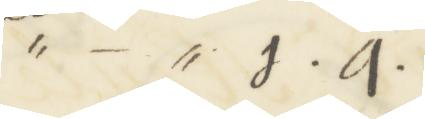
_„o — „ 1. 4.
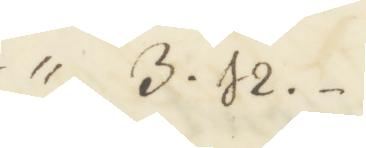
„ 3. 12. –
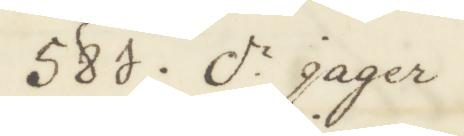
581. c.r jager
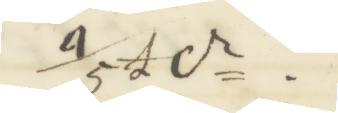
4/5 t c=r.
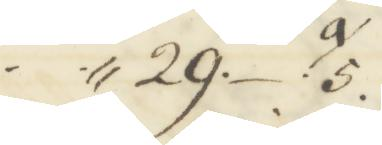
. „ 29. — 4/5
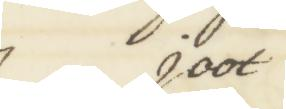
„ joot
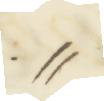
3/5 - . „
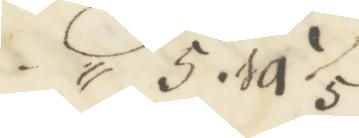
- „ 5.14 1/5
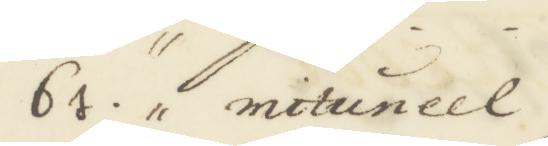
61. „ mituneel
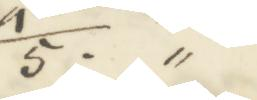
1/5. „
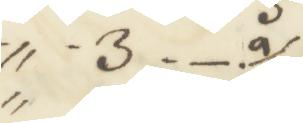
„ - 3 - — 4/5.
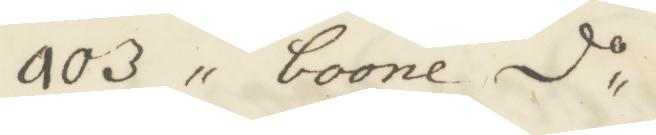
403 „ boone d„o
